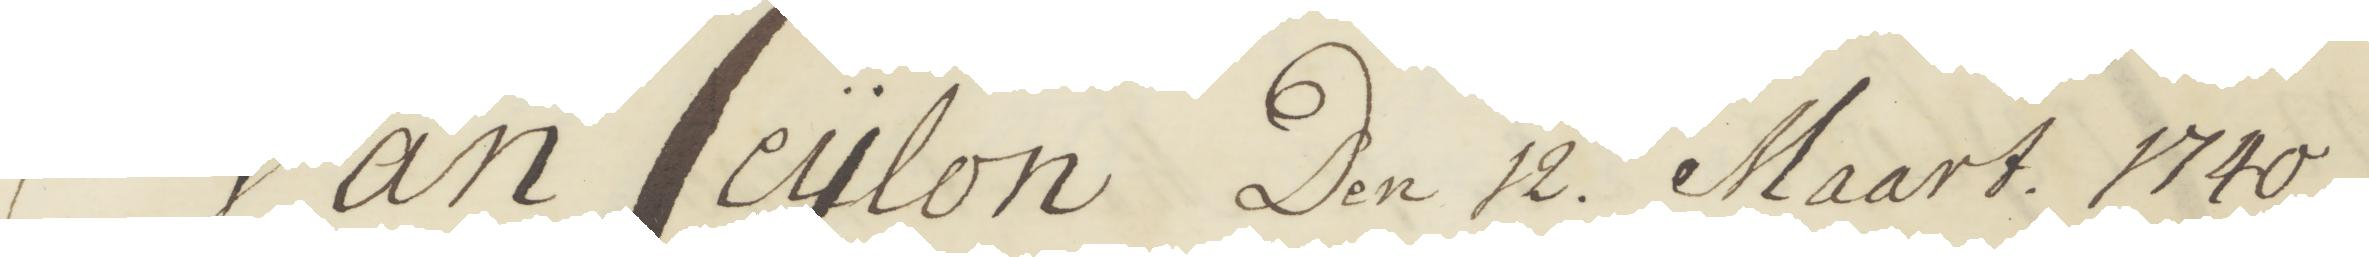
Van Ceijlon Den 12. Maart. 1740.
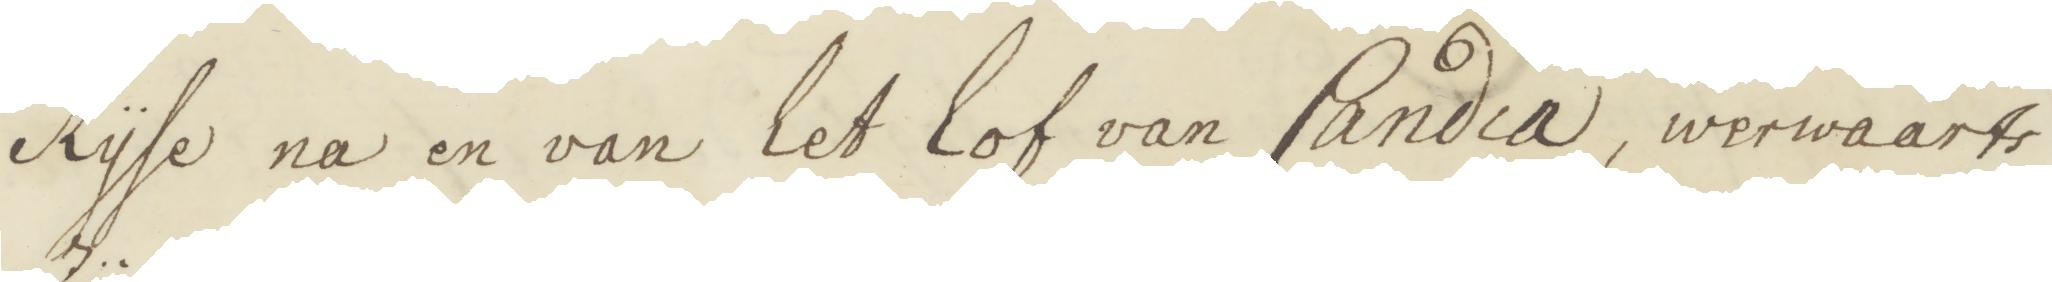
Rijse na en van het hof van Candia, werwaarts
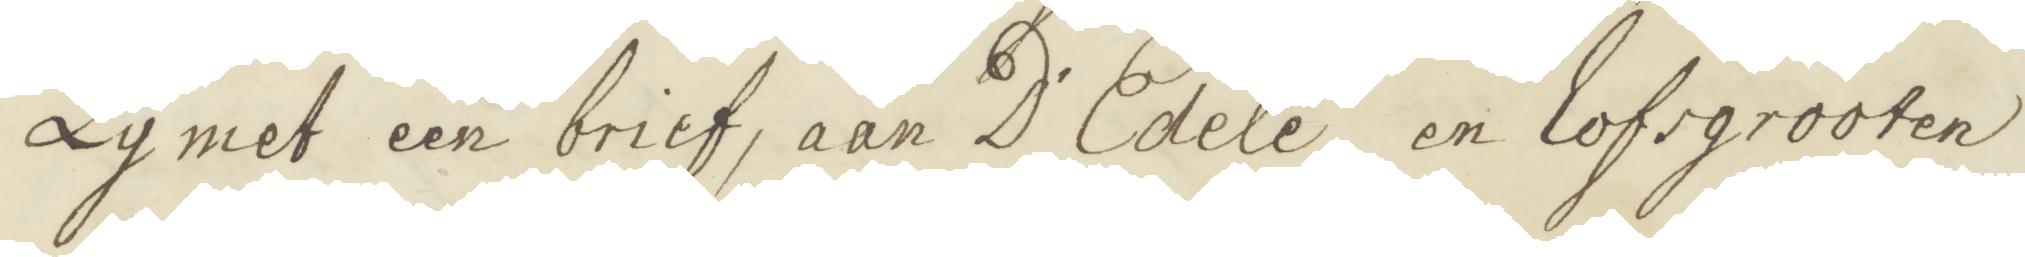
zij met een brief, aan D’ Edele en hofsgrooten
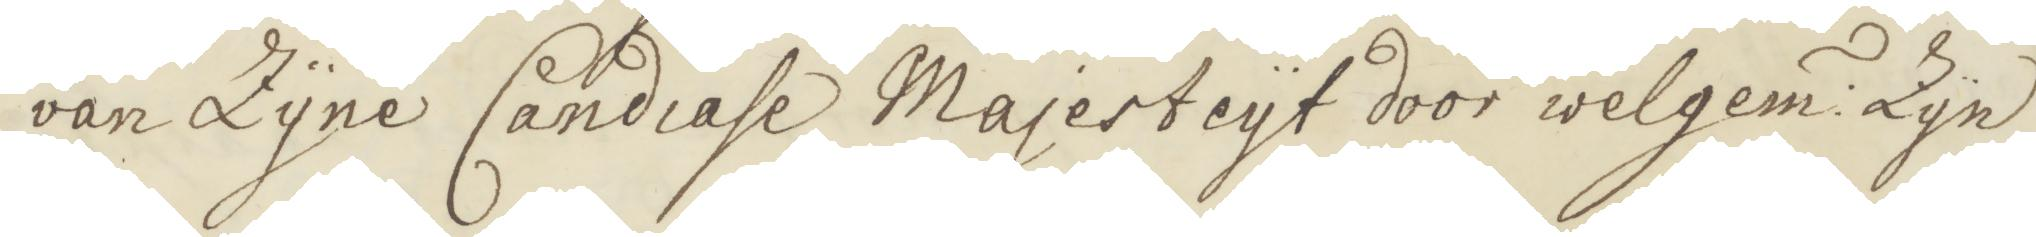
van zijne Candiase Majesteijt door welgem: zijn
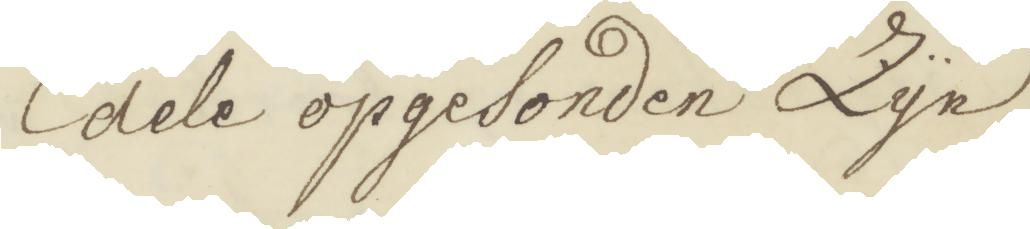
Edele opgesonden zijn
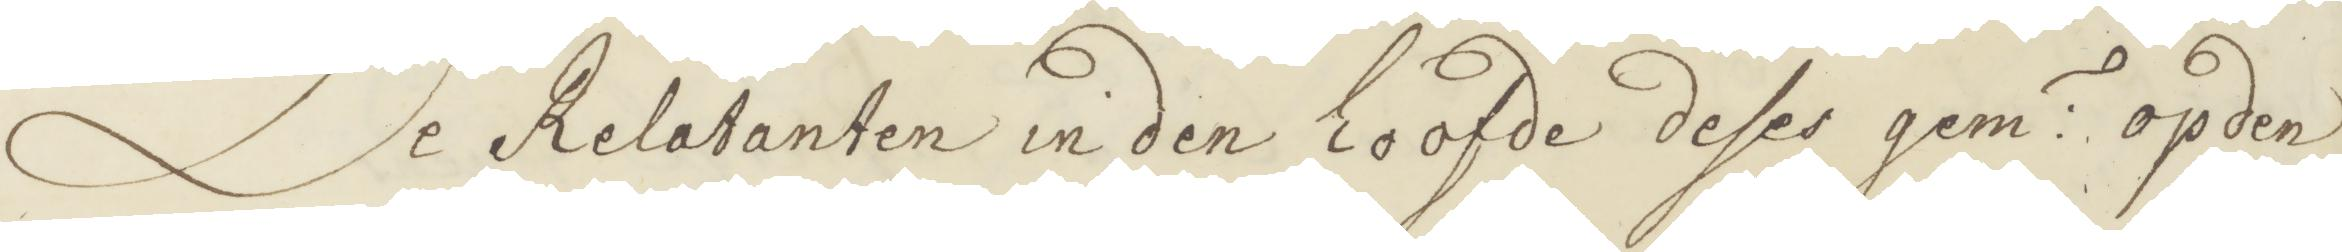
De Relatanten in den hoofde deses gem: op den
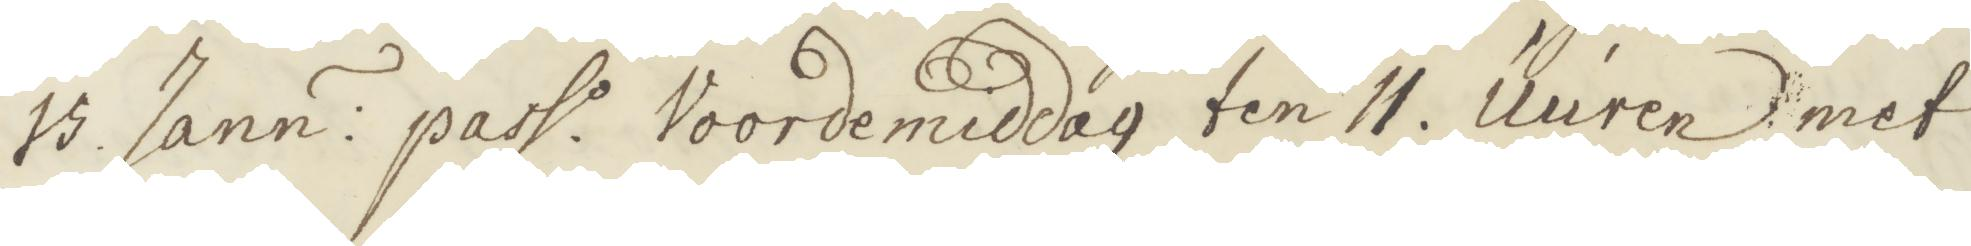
15. Jann: pass.o voordemiddag ten 11. Uuren met
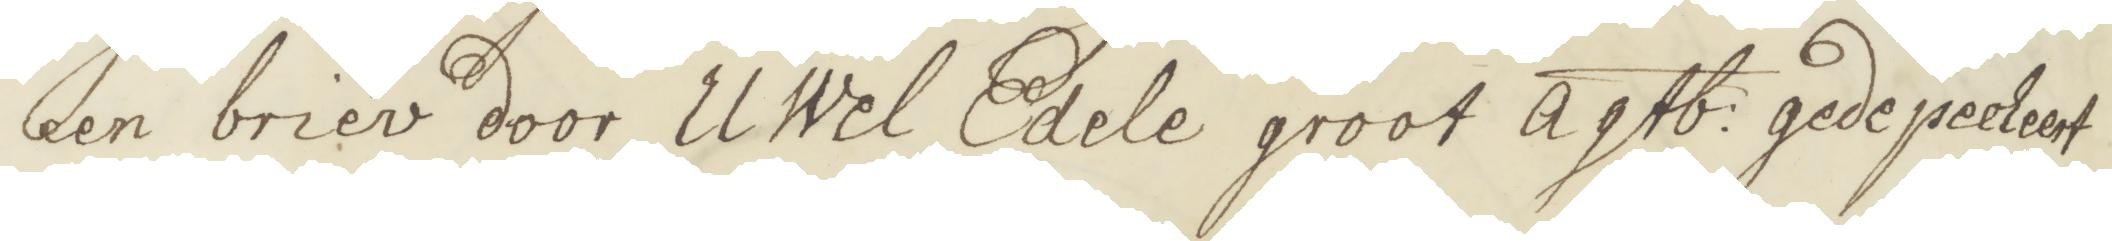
den briev door U Wel Edele groot Agtb: gedepecheert
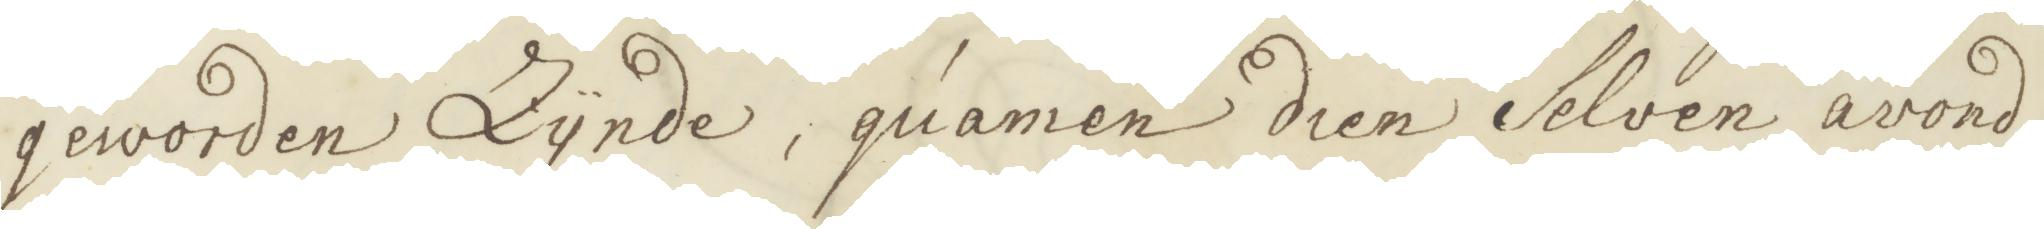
geworden zijnde, quamen dien selven avond
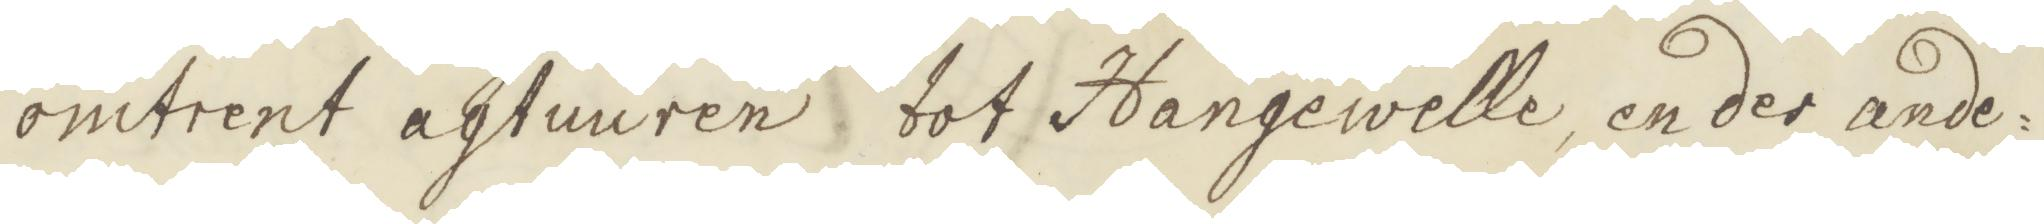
omtrent agtuuren tot Hangewelle, en der ande=
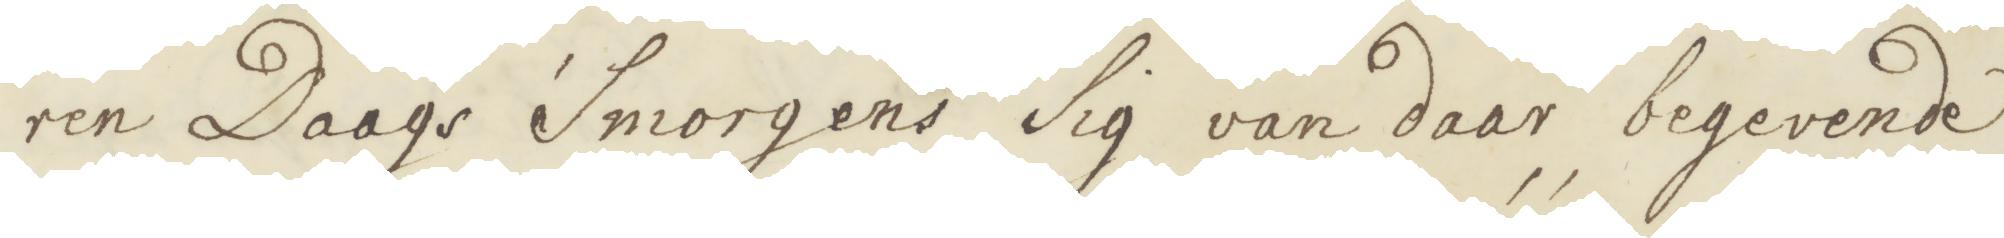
ren Daags 'smorgens sig van daar begevende
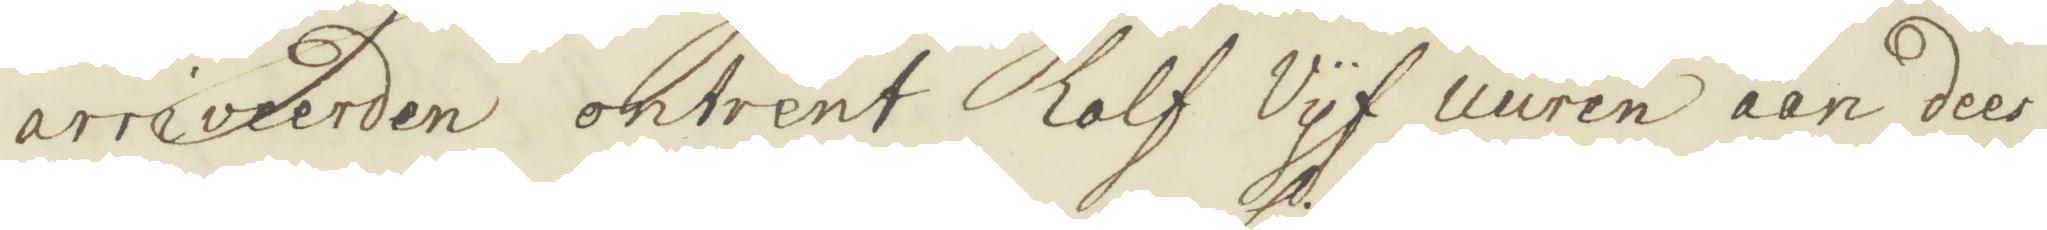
arriveerden ontrent half vijf uuren aan deer
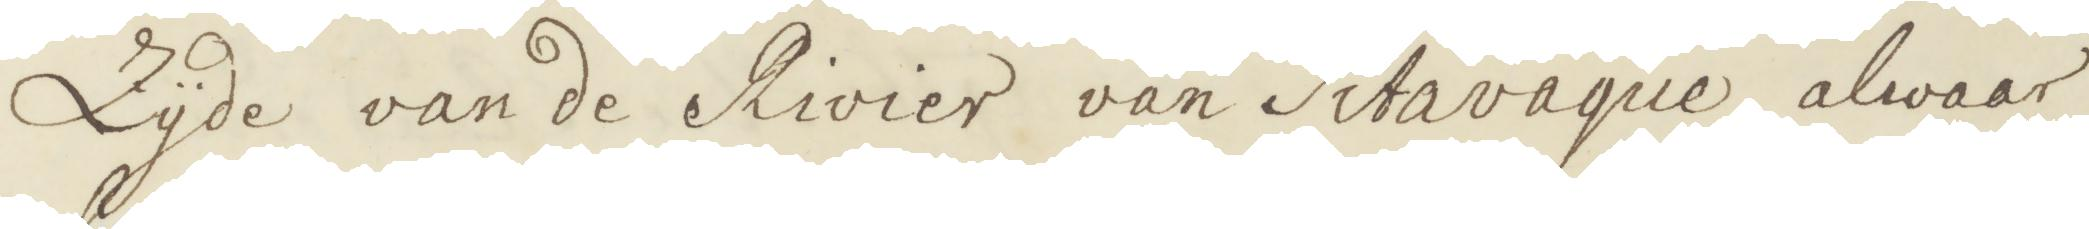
Zijde van de Rivier van Sitavaque alwaar
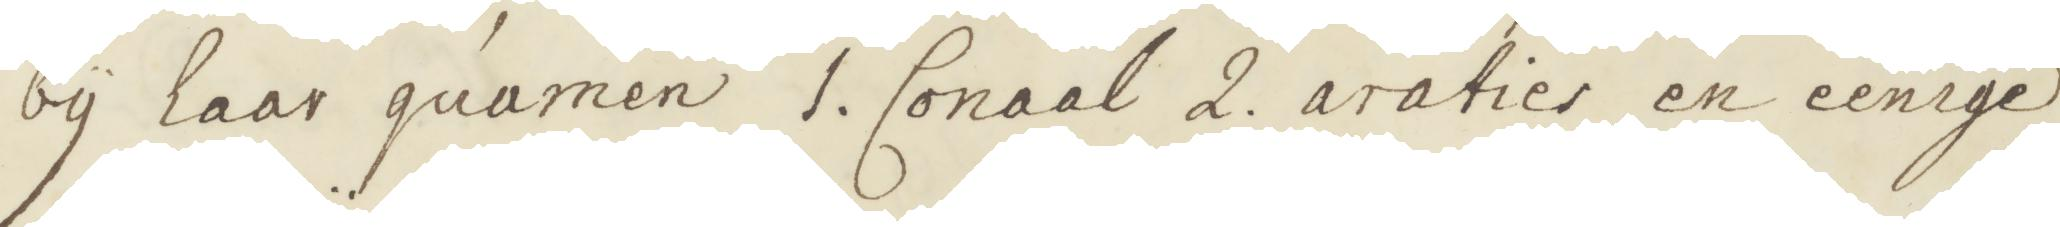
bij haar quamen 1. Conaal 2. araties en eenige
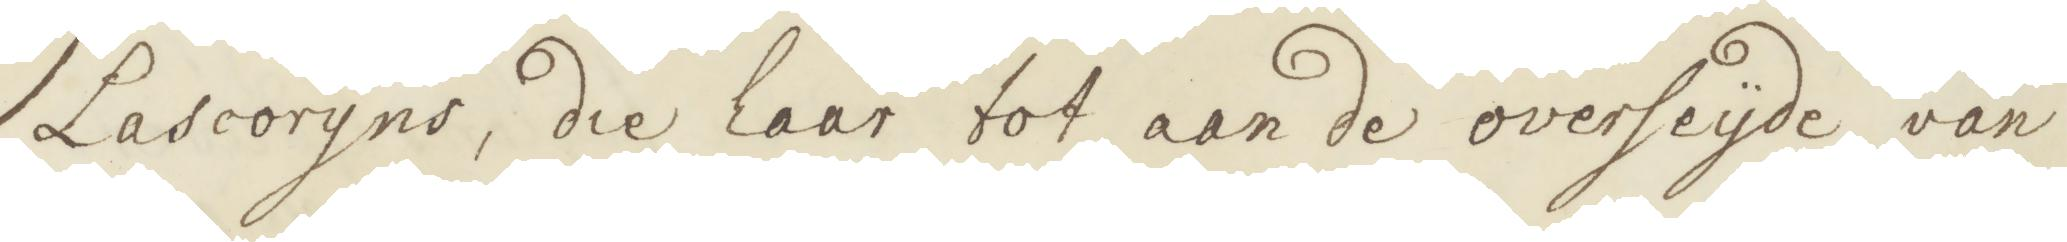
Lascorijns, die haar tot aan de overseijde van
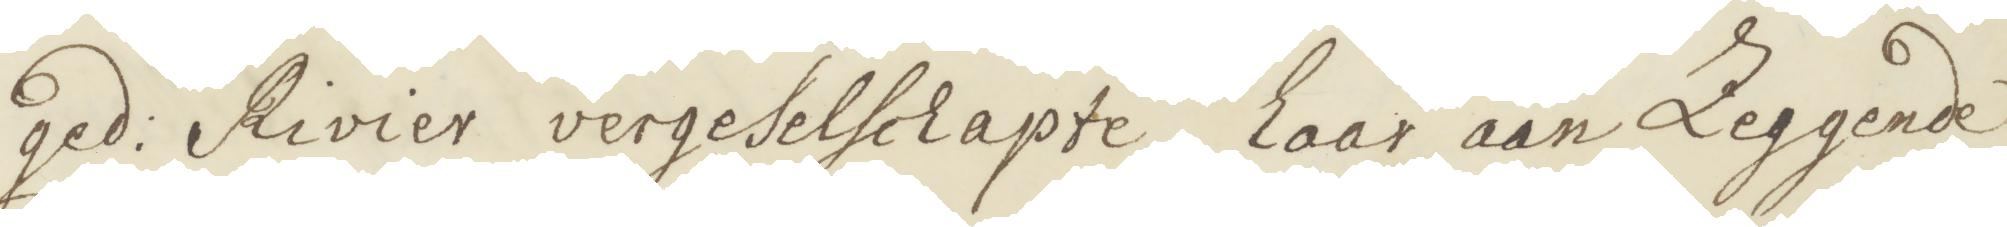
ged: Rivier vergeselschapte, hoor aan zeggende
